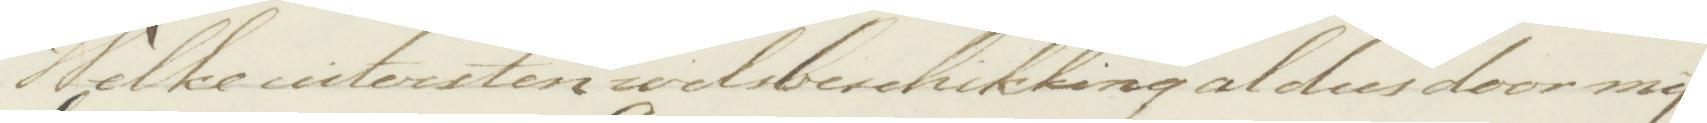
Welke uitersten wilsbeschikking aldus door mij
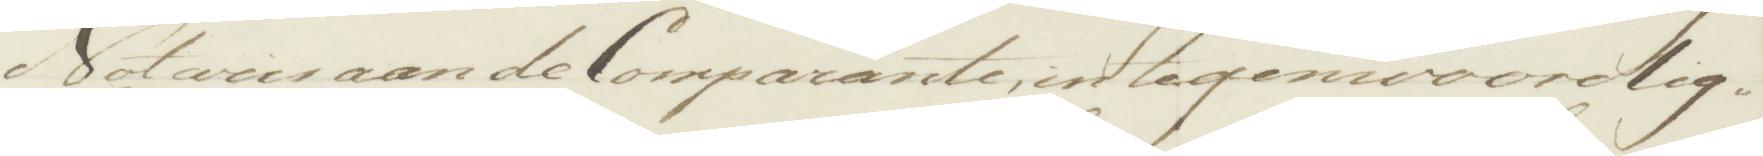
Notaris aan de Comparante, in tegenwoordig„
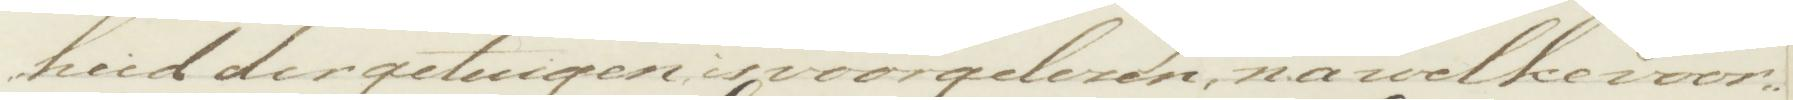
heid der getuigen is voorgelezen, nawelke voor„
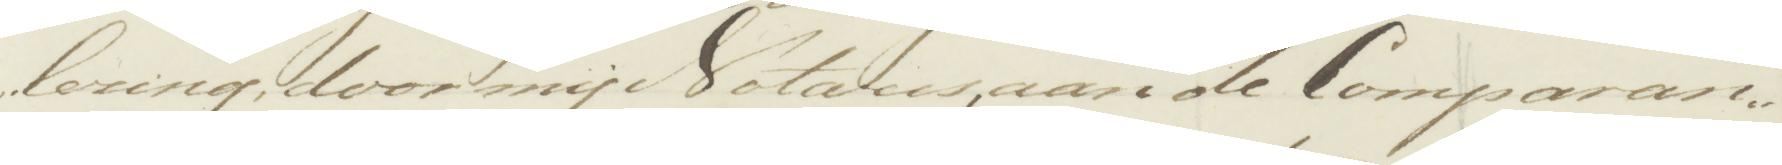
„lezing, door mij Notaris, aan de Comparan„
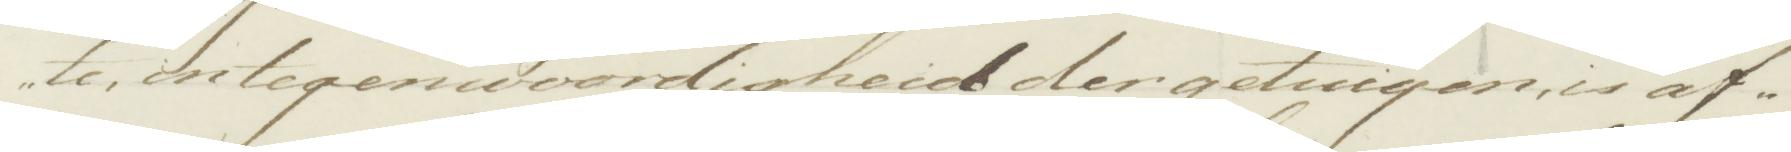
„te, in tegenwoordigheid der getuigen, is af„
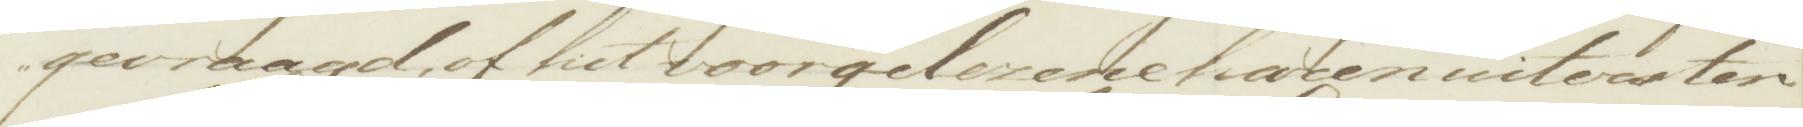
„gevraagd, of het voorgelezene haren uitersten
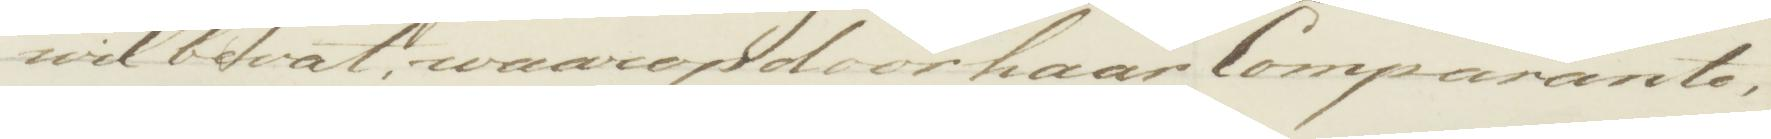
wil bevat, waarop door haar Comparante,
